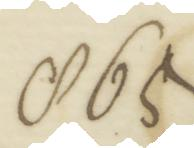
865
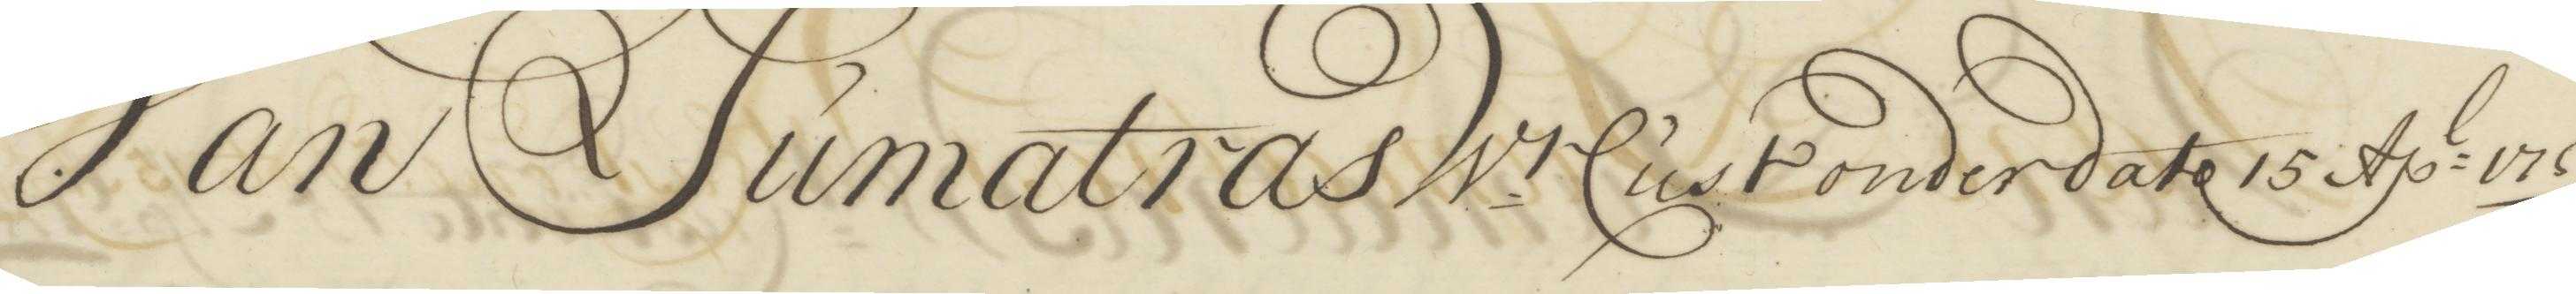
Van Sumatras w:t Cust onder dato 15 Ap=l 175
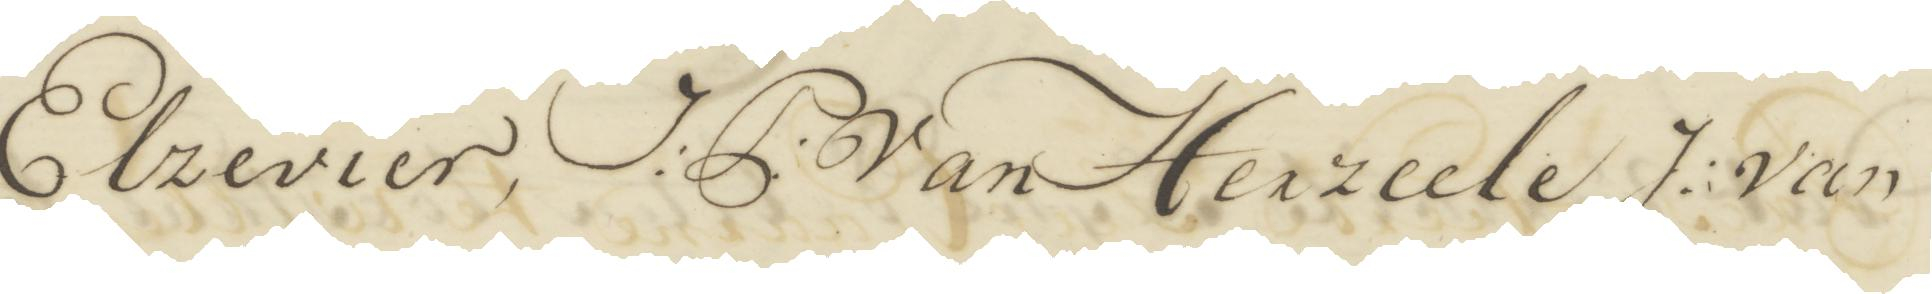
Elzevier, I: P: van Herzeele J.: van
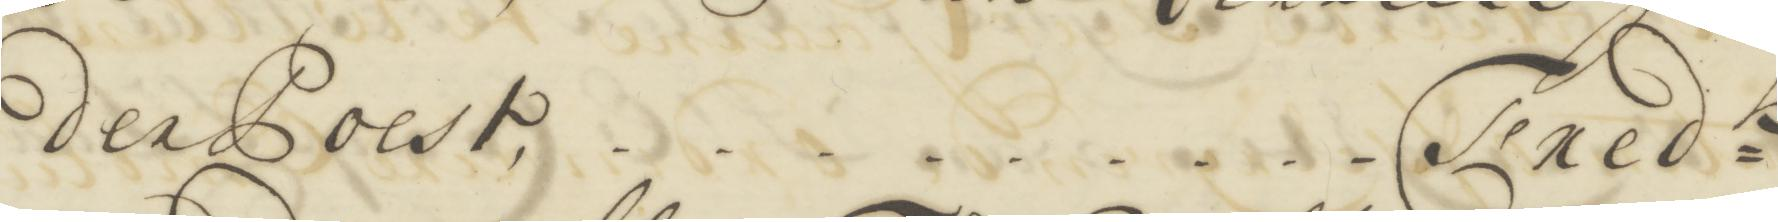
der Poest, . . . . . . . . . Fred=k
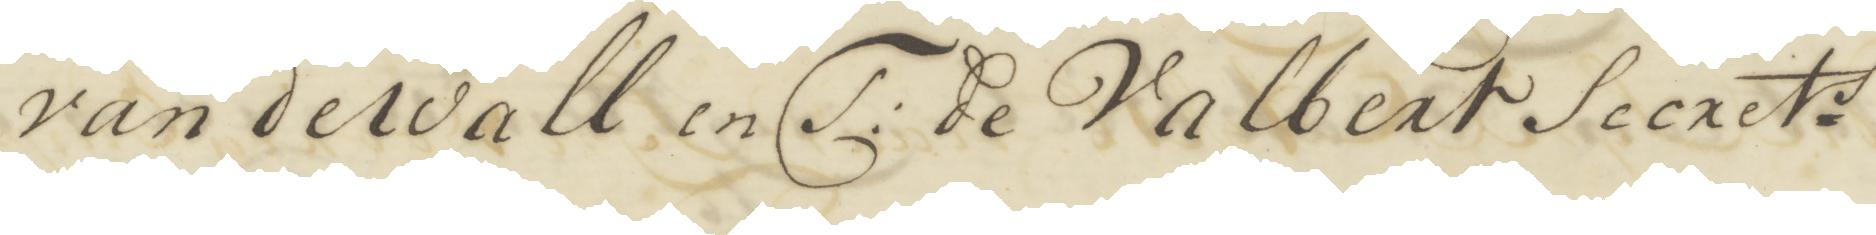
van dewall en T: de Valbert secret=s
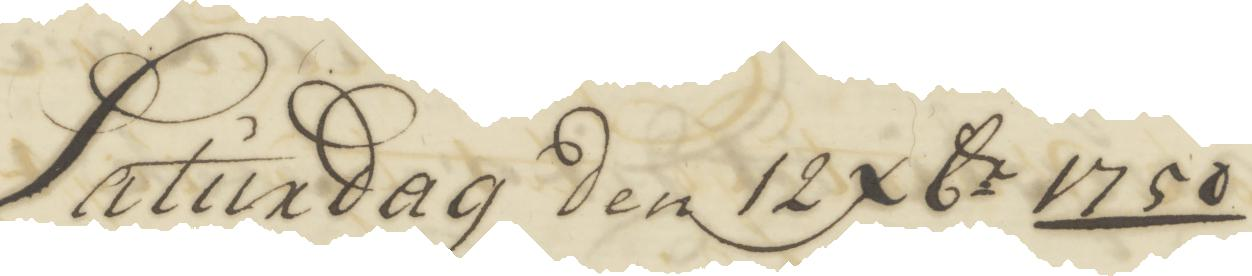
Saturdag den 12 xb=r 1750
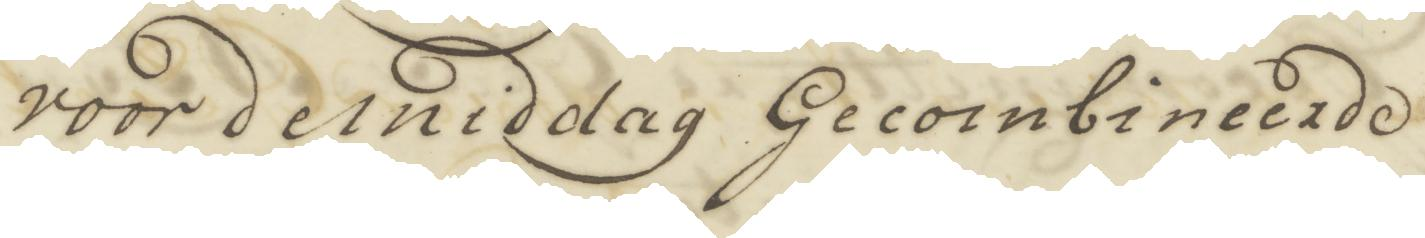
voor de middag Gecombineerde
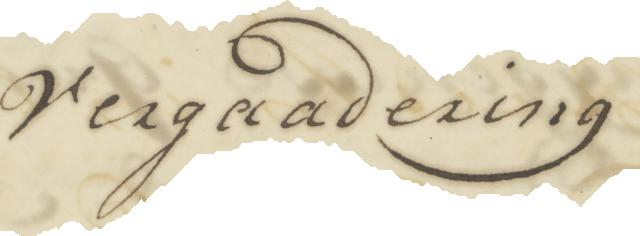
Vergaadering
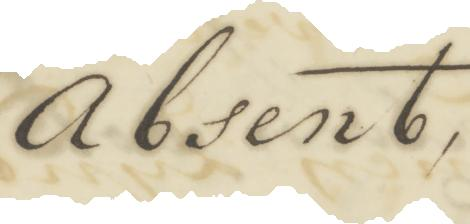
Absent,
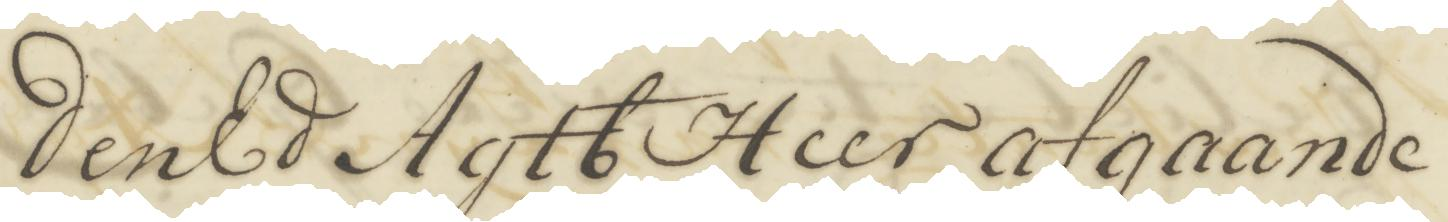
den Ed Agtb Heer afgaande
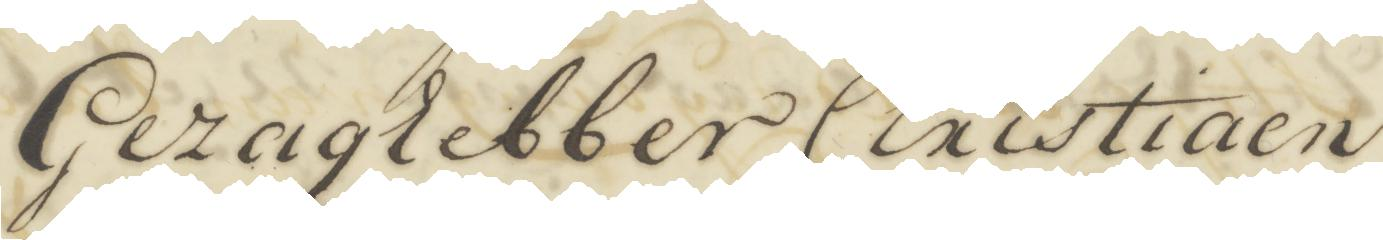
Gezaghebber Christiaen
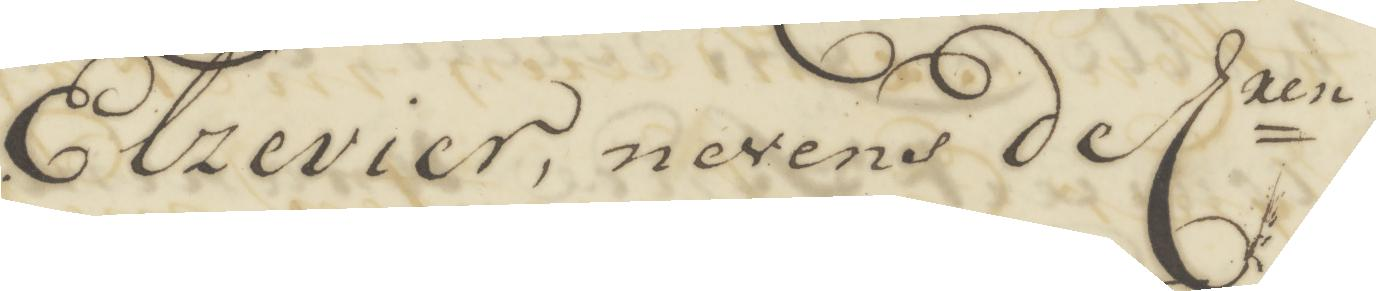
Elzevier, nevens de H=ren
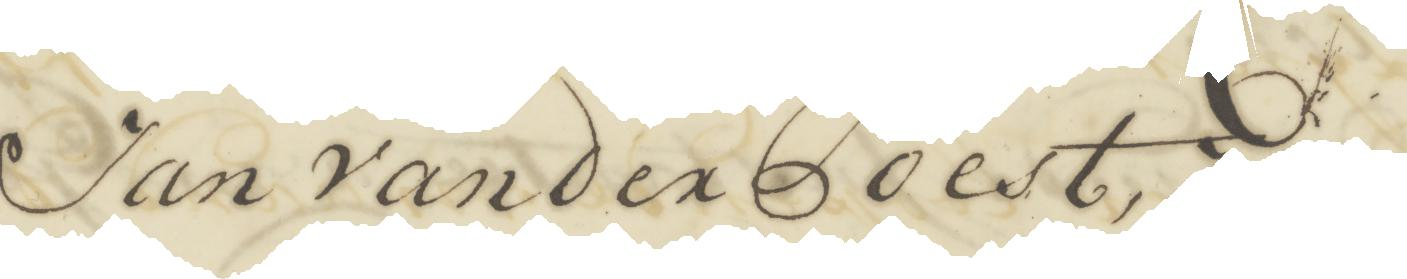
Jan van der Poest, Jan
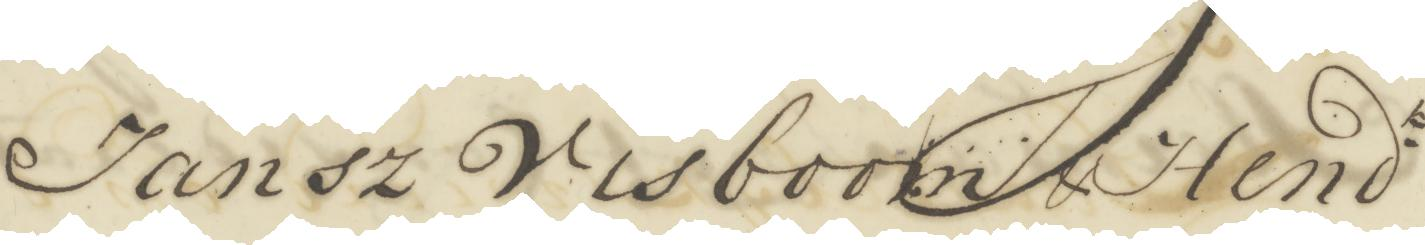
Jansz Visboom & Hend-k
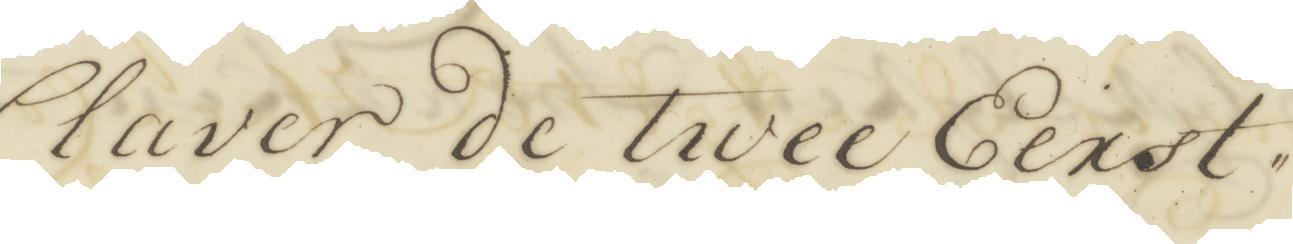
Claver de twee Eerst„
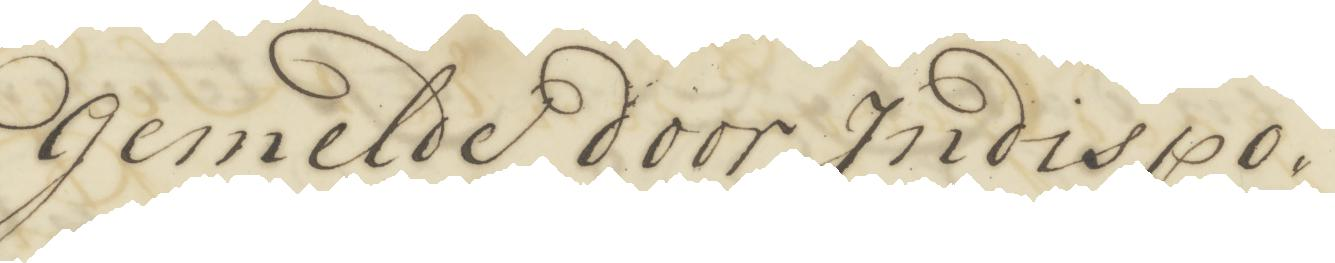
gemelde door Indispo„
